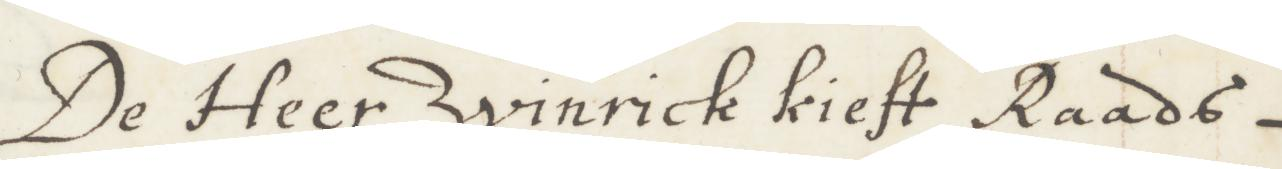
De Heer Winrick kieft Raads —
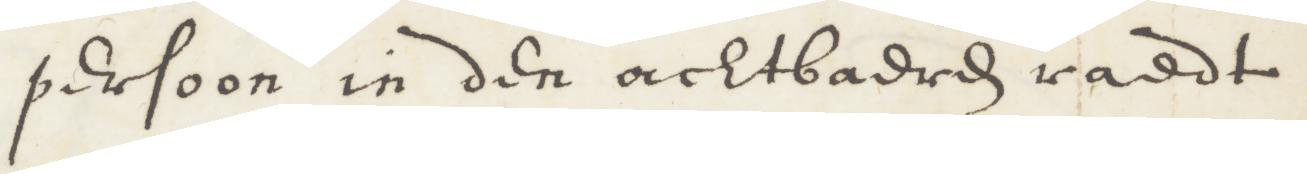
persoon in den achtbaeren raedt
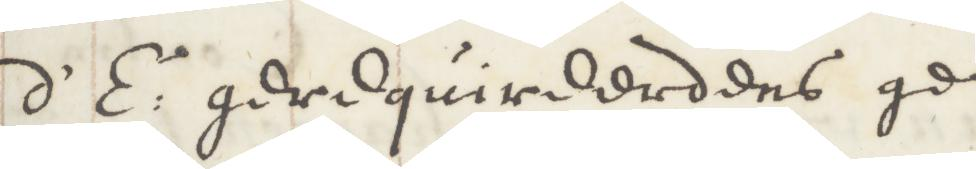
d’E: gerequireerdens ge
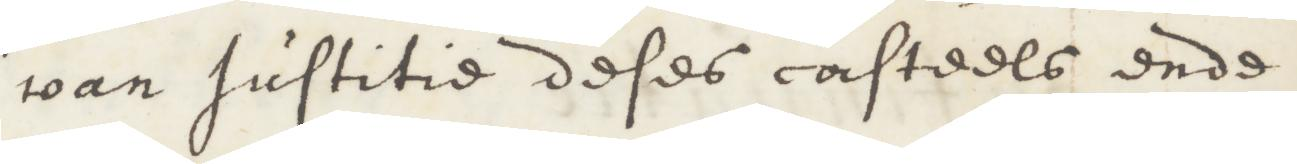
van Justitie deses casteels ende
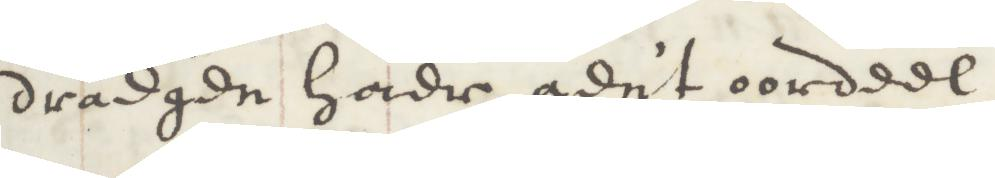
draegen haer aen ’t oordeel
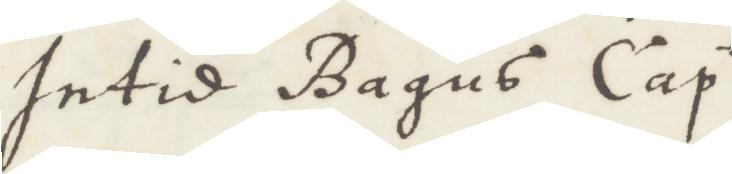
Jntie Bagus Cap=teijn van de —
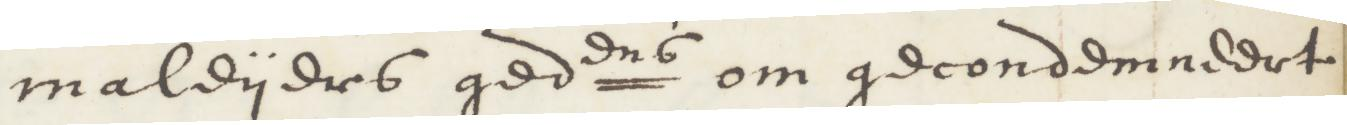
maleijers ged=ens om gecondemneert
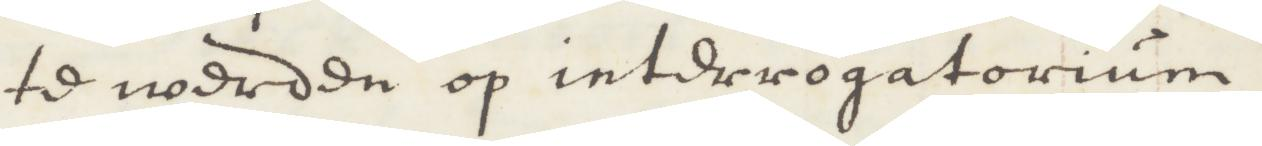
te werden op interrogatorium
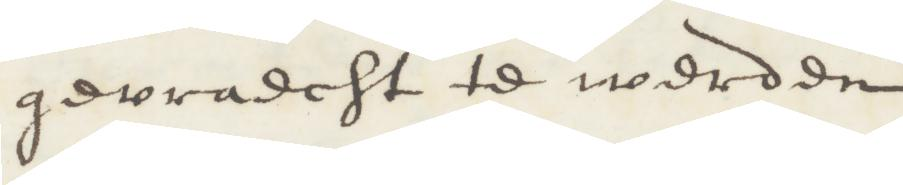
gevraecht te werden
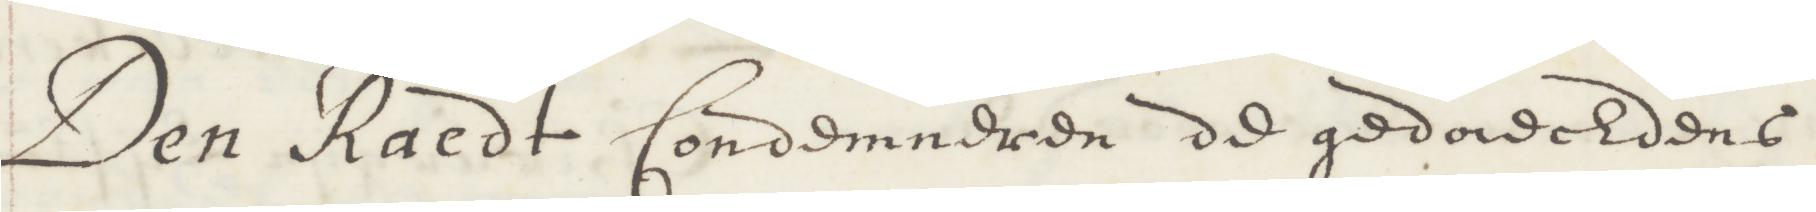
Den Raedt Condemneren de gedaechdens
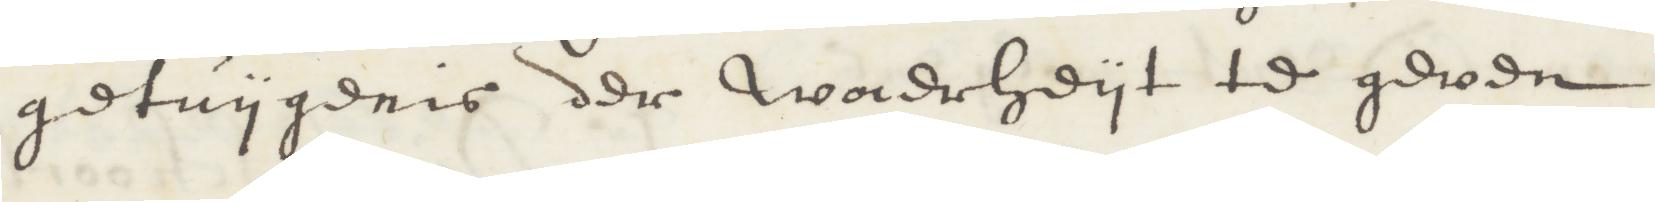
getuijgenis der Waerheijt te geven
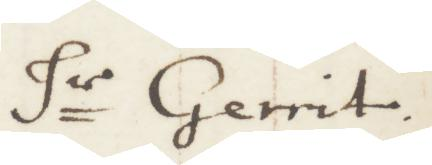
S=r Gerrit.
